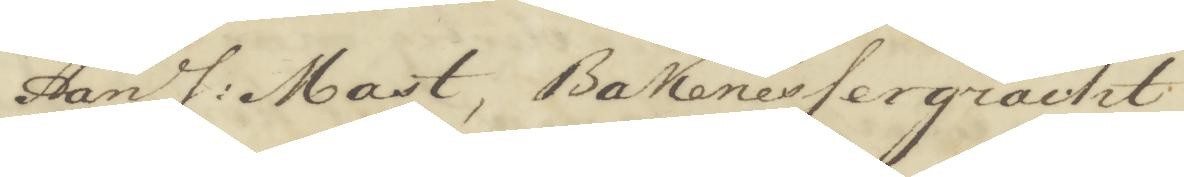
Aan J: Mast, Bakenessergracht
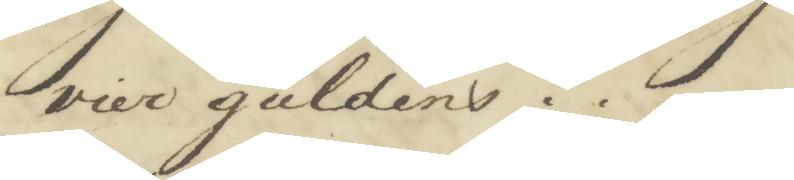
vier guldens . . . . . . . . . „ 4. —
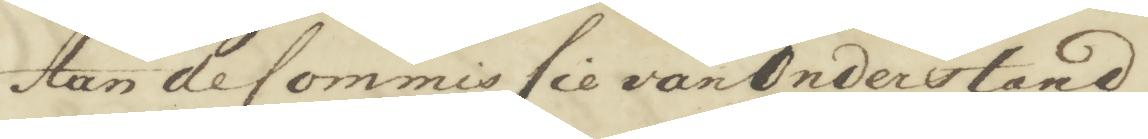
Aan de Commissie van Onderstand
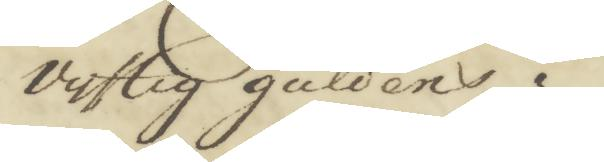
vijftig guldens . . . . . . . . . „ 50. —
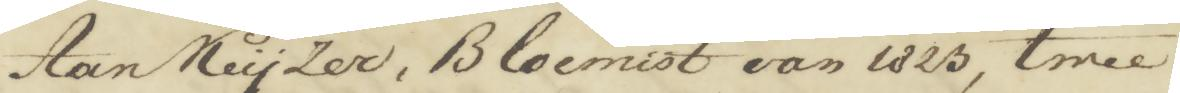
Aan Keijzer, Bloemist van 1823, twee
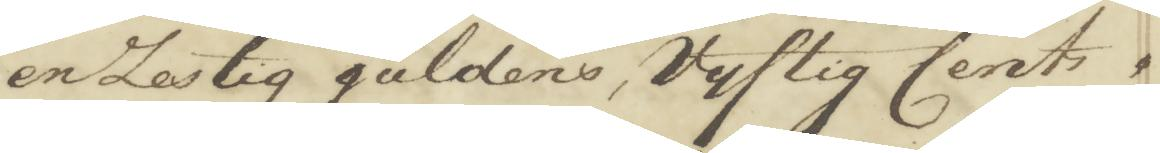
en Zestig guldens, Vyftig Cents „ 62. 50.
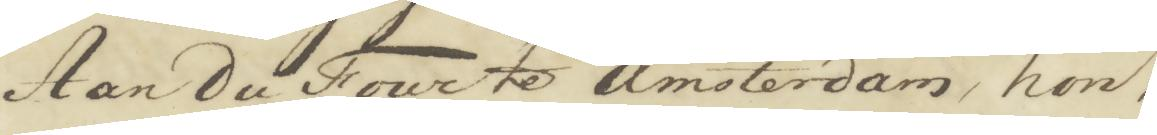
Aan du Fourte Amsterdam, hon„
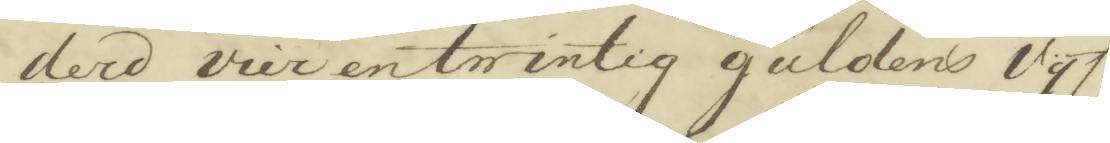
derd vier en twintig guldens vijf
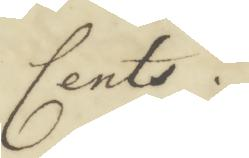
Cents . . . . . . . . . . . . . . . . . . „ 124. 05.
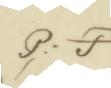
P. T ƒ
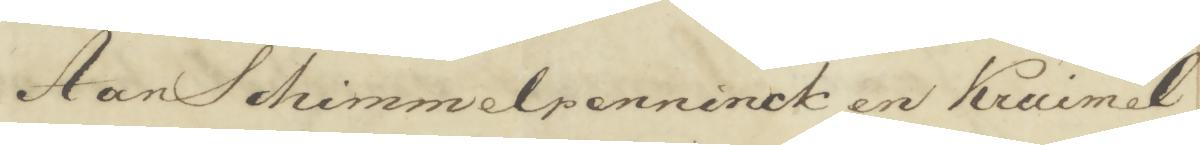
Aan Schimmelpenninck en Kruimel
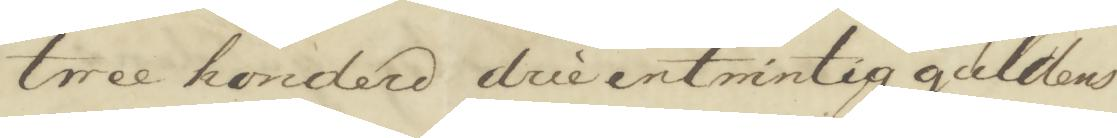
twee honderd drie en twintig gulden
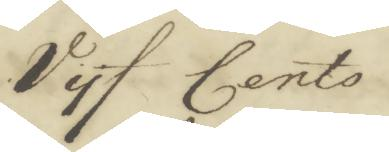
Vijf Cents . . . . . . . . . . . . . „ 223. 05.
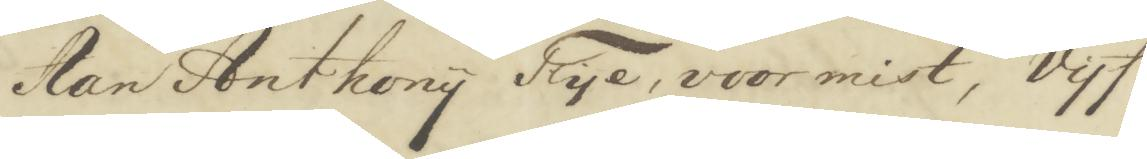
Aan Anthonij Fije, voor mist, vijf
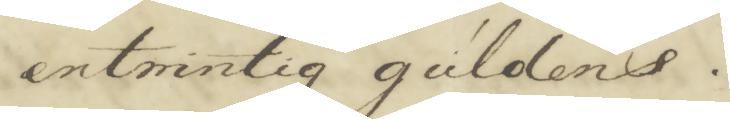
en twintig guldens . . . . . . . „ 25„ —.
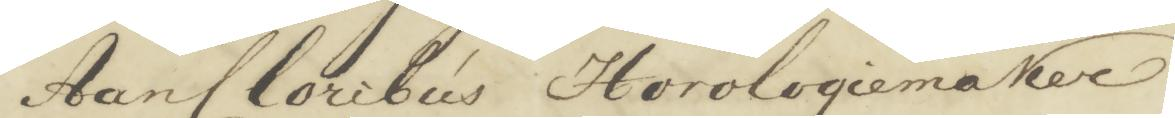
Aan Cloribus Horologiemaker
